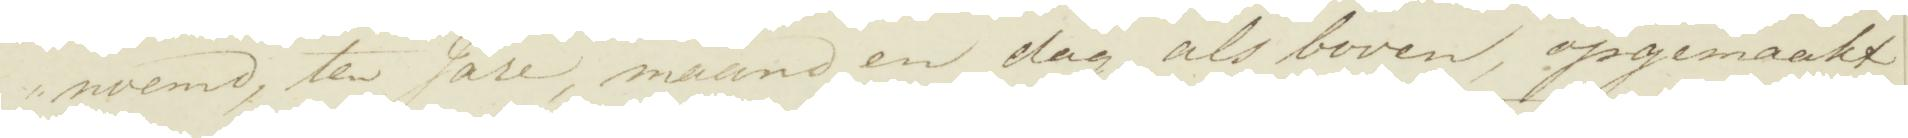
„noemd, ten Jare, maand en dag als boven, opgemaakt
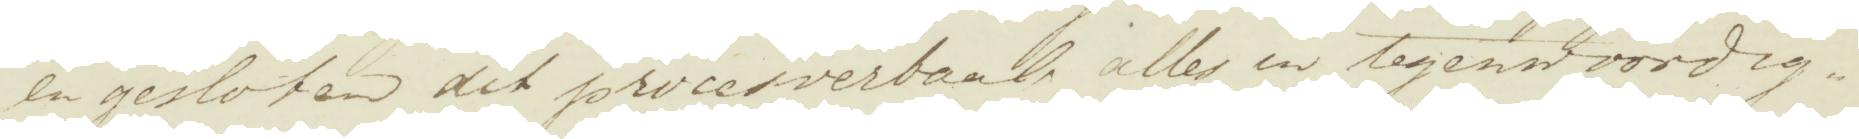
en gesloten dit procesverbaal, alles in tegenwoordig„
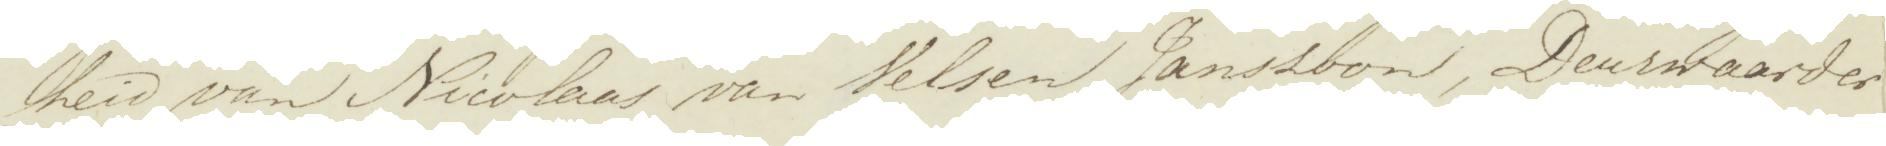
heid van Nicolaas van Velsen Janszoon, Deurwaarder
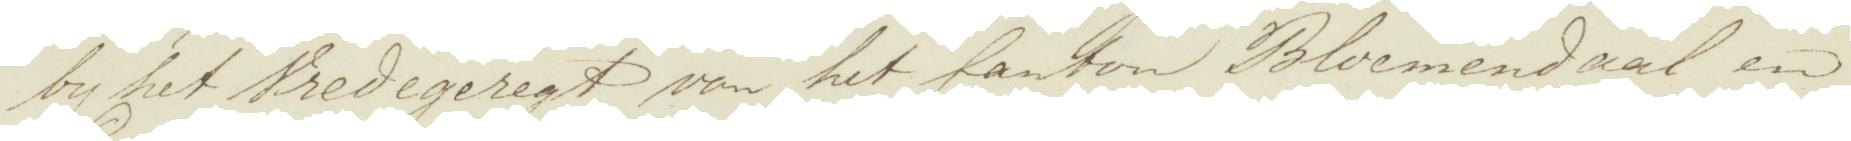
by het Vredegeregt van het Canton Bloemendaal en
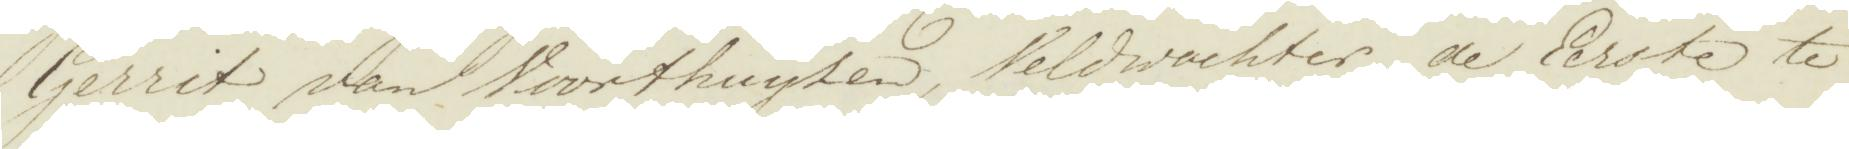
Gerrit van Voorthuyzen, Veldwachter, de Eerste te
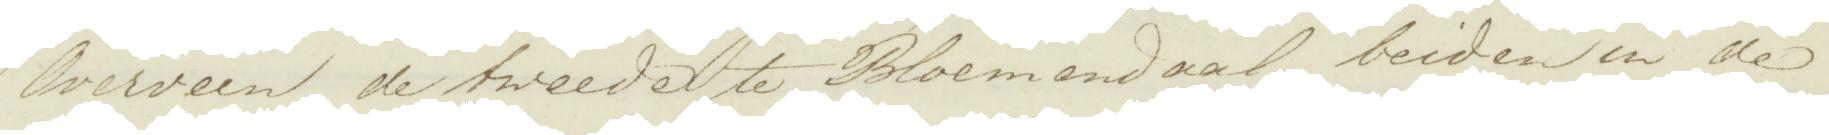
Overveen, de tweede te Bloemendaal, beiden in de
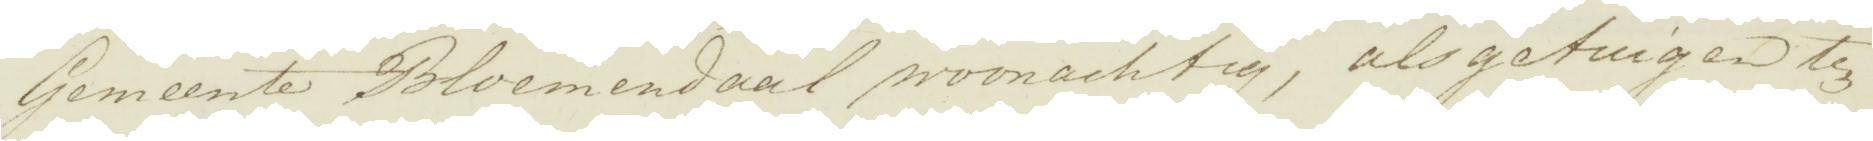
Gemeente Bloemendaal woonachtig, als getuigen ten
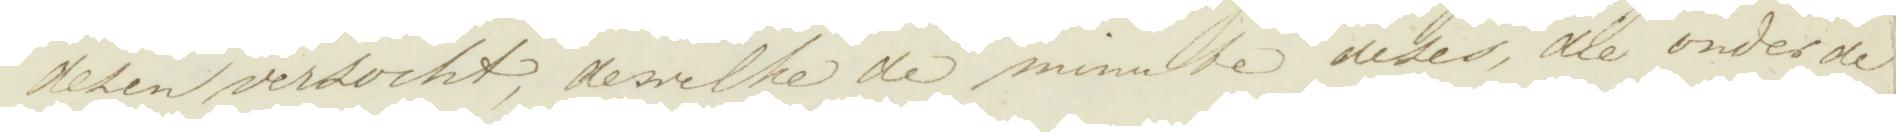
dezen verzocht, dewelke de minute dezes, die onder de
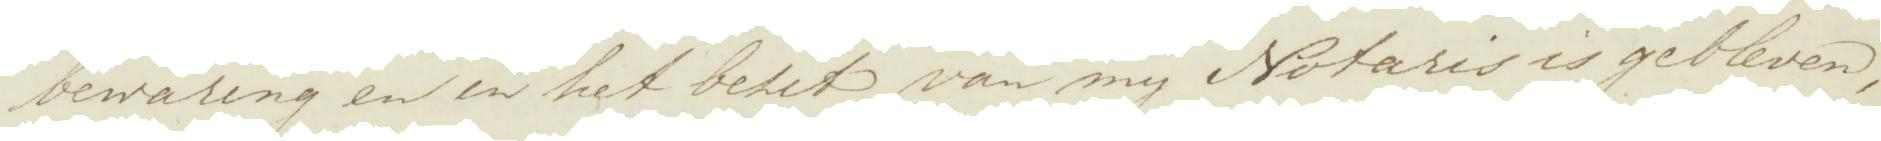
bewaring en in het bezit van my Notaris is gebleven
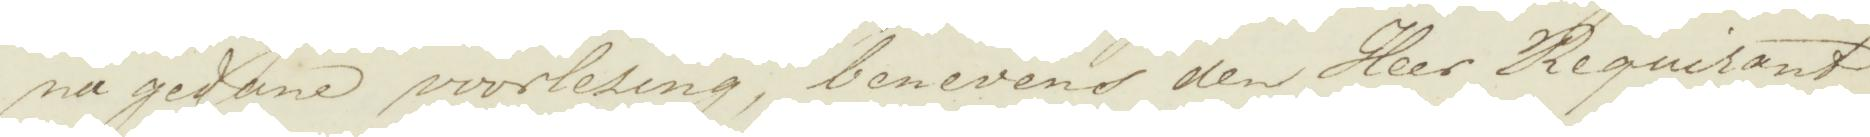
na gedane voorlezing, benevens den Heer Requirant
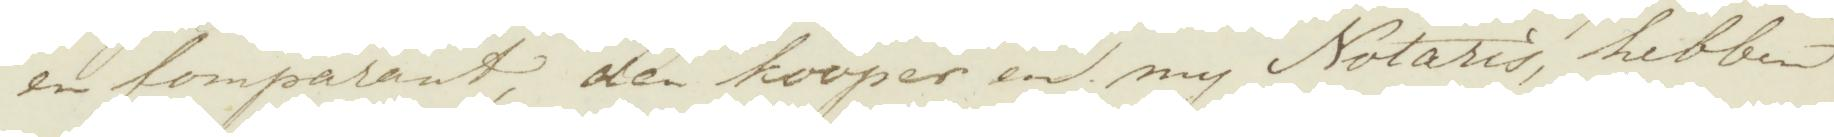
en Comparant, den kooper en my Notaris, hebben,
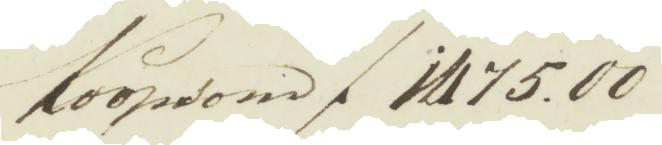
Koopsom ƒ 1475.00
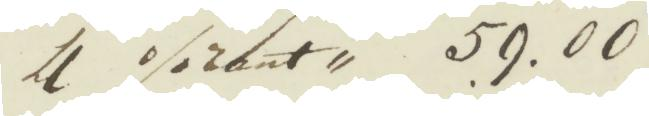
4% rent „ 59.00
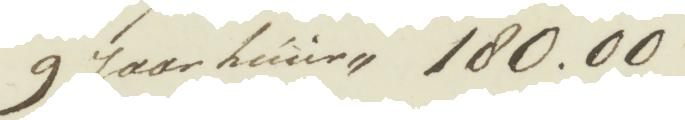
9 Jaar huur „ 180.00
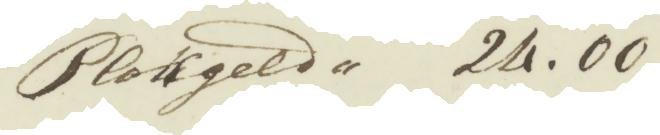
Plokgeld „ 24.00
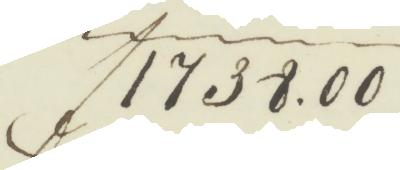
ƒ 1738.00
